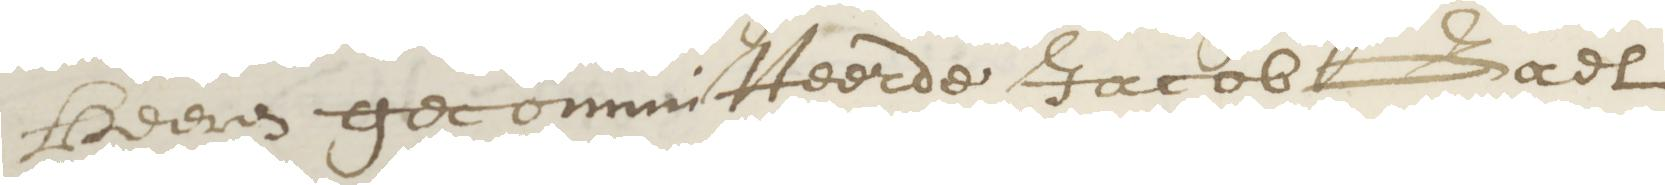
Heeren gecommitteerde Jacob Gael
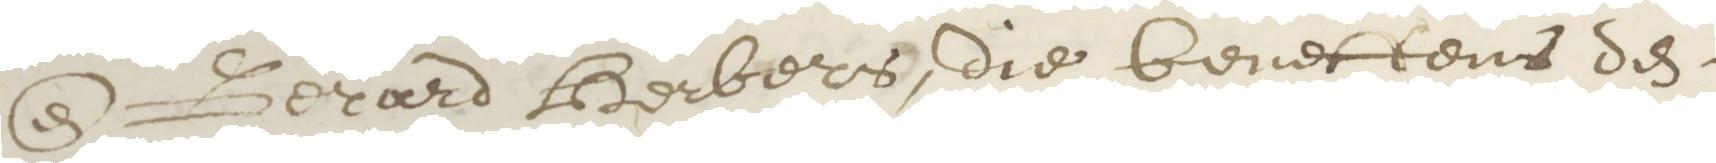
ende Gerard Herbers, die beneffens den
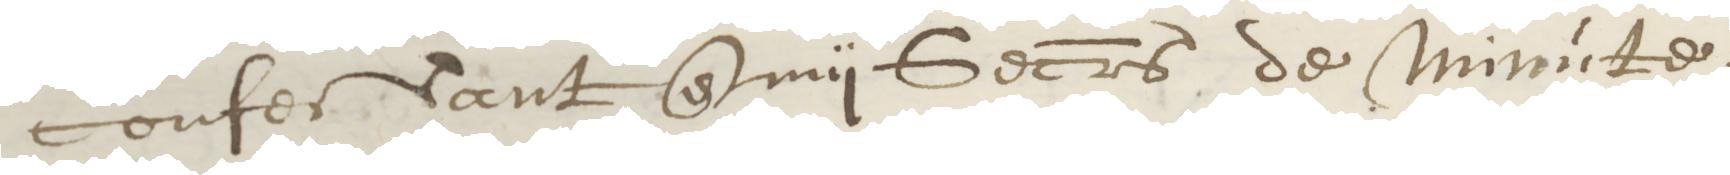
confestant ende mij Secrs de minute
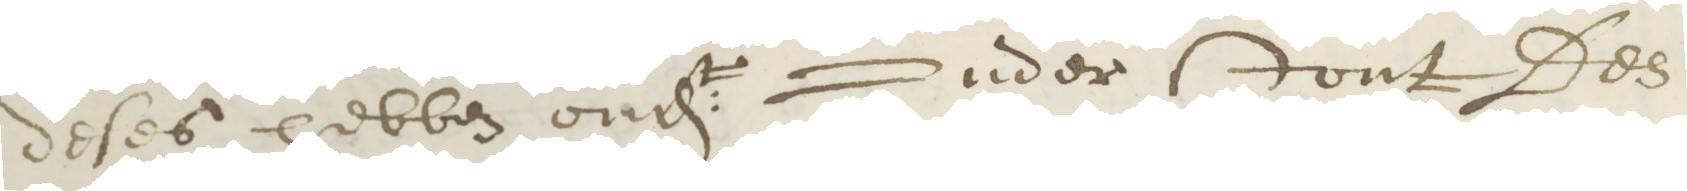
deses hebben ond:t Onder stont Des
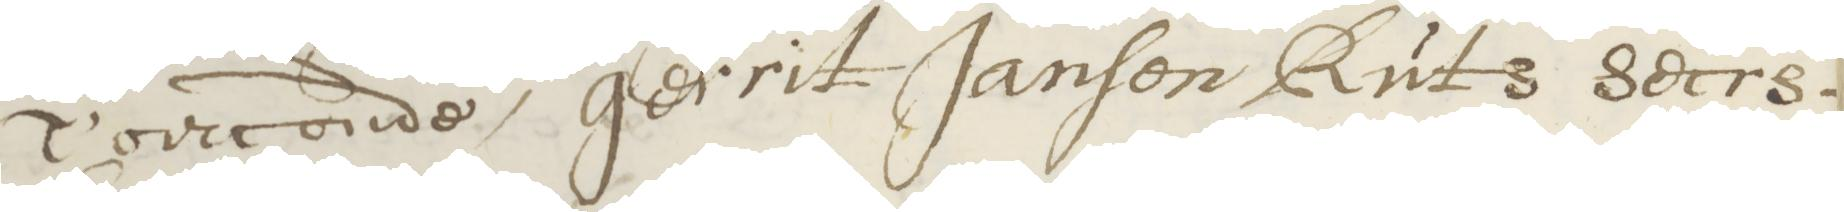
T'oerconde, gerrit Jansen Ruts secrs-
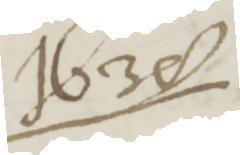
1638
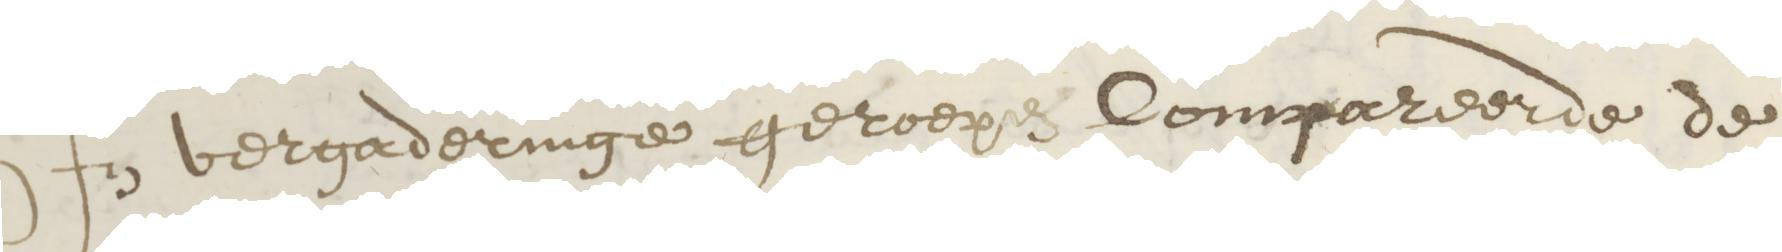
In vergaderinge geroepen Compareerde de
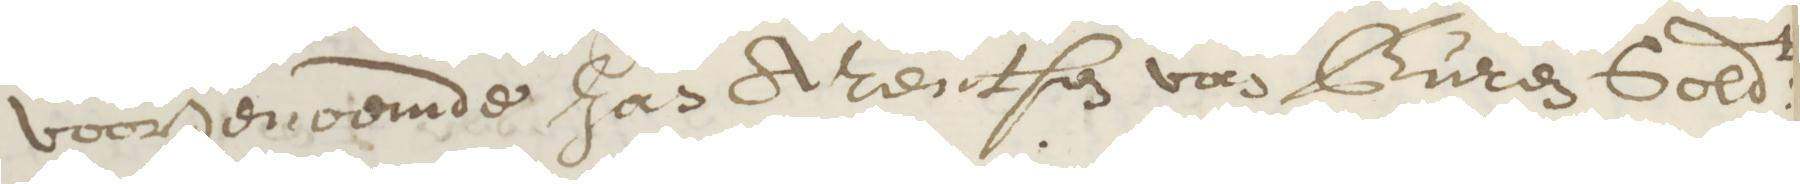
voorgenoemde Jan Arentsen van Buren sold:t
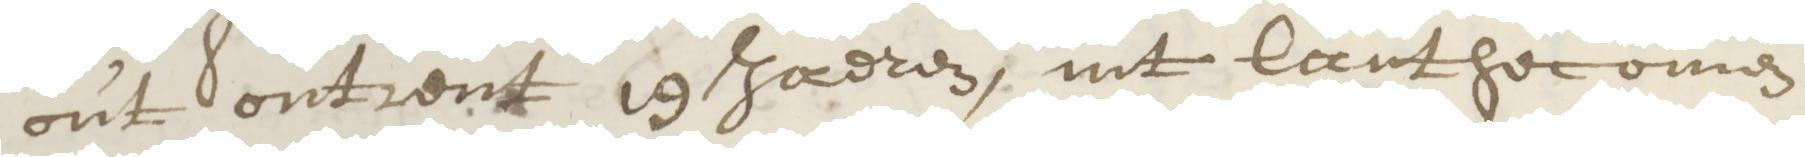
out ontrent 19 Jaeren, int lant gecomen
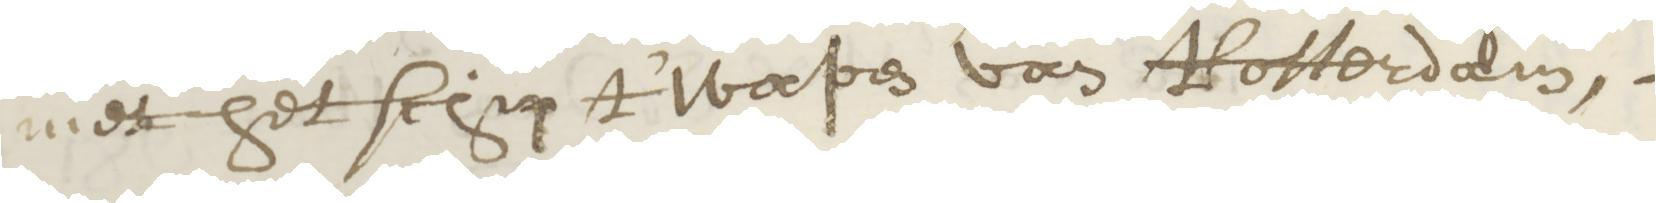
met het schip t' Wapen van Rotterdam,
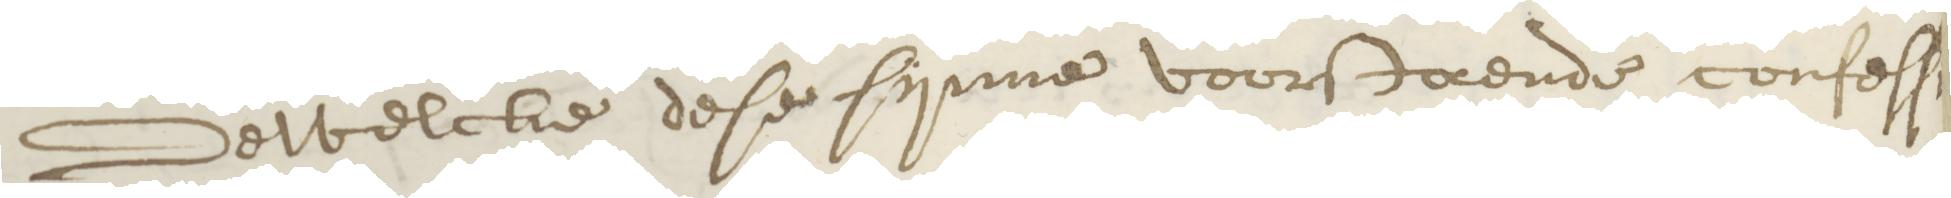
Dewelcke dese sijnne voorstaende confessi
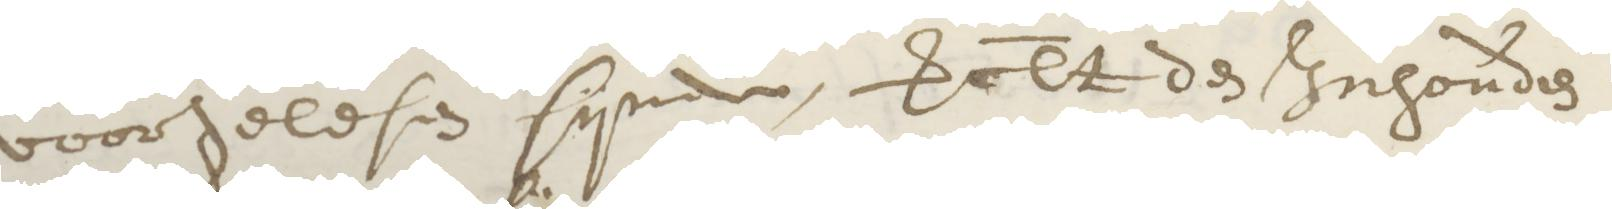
voorgelesen sijnde, verclt den Jnhouden
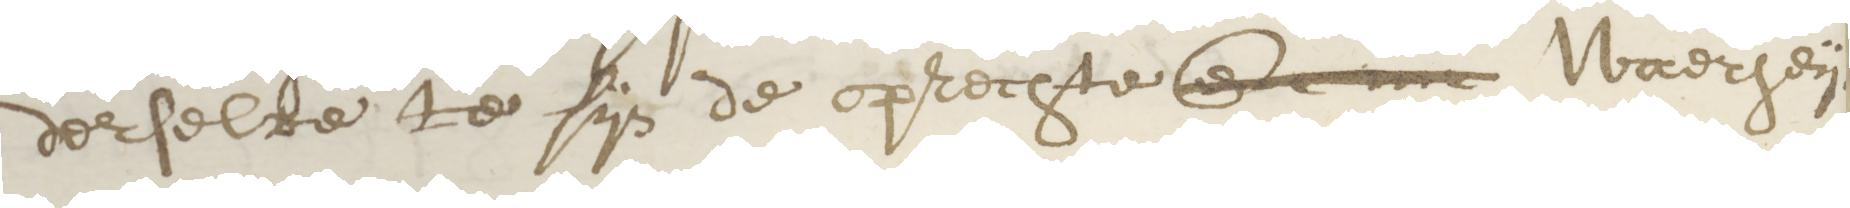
derselve te sijn de oprechte ende im waerheij
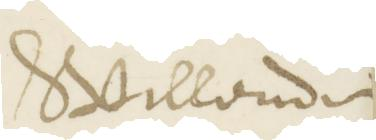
Willende
